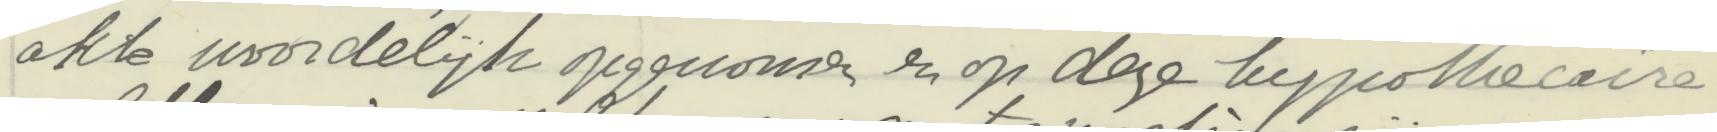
akte woordelijk opgenomen en op deze hypothecaire
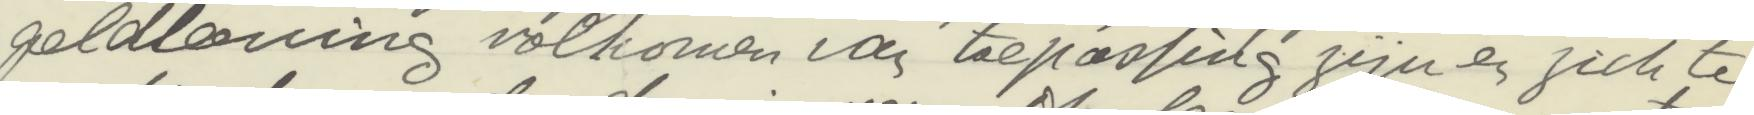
geldleening volkomen van toepassing zijn en zich te
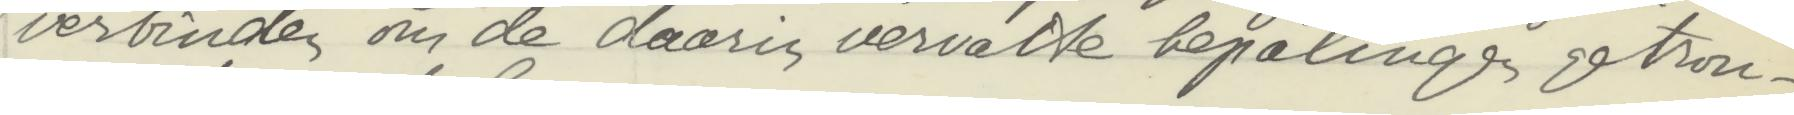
verbinden om de daarin vervatte bepalingen getrou-
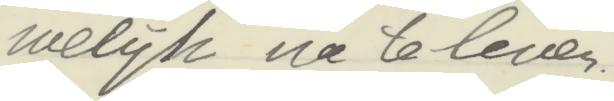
welijk na te leven
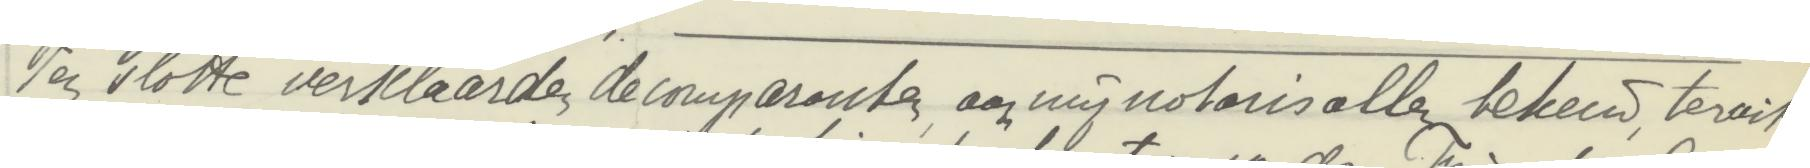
Ten slotte verklaarden de comparanten, aan mij notaris alle bekend, ter uit-
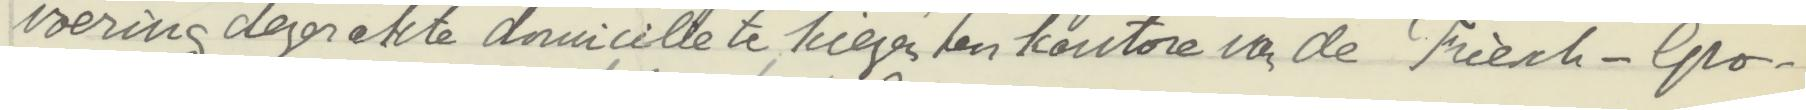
voering dezer akte domicille te kiezen ten kantore van de Friesch - Gro-
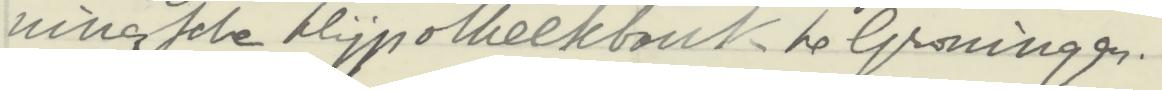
ningsche Hijpotheekbank te Groningen.
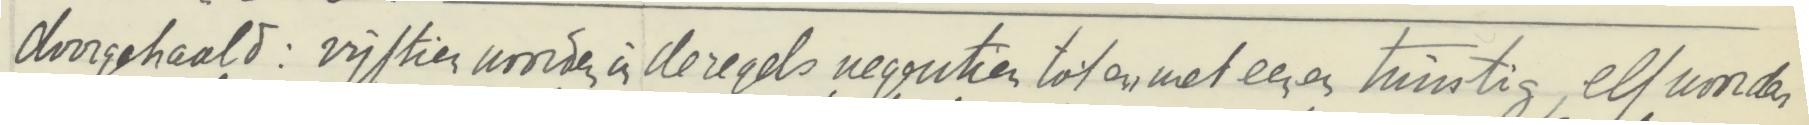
doorgehaald: vijftien woorden in de regels negentien tot en met een en twintig, elf woorden
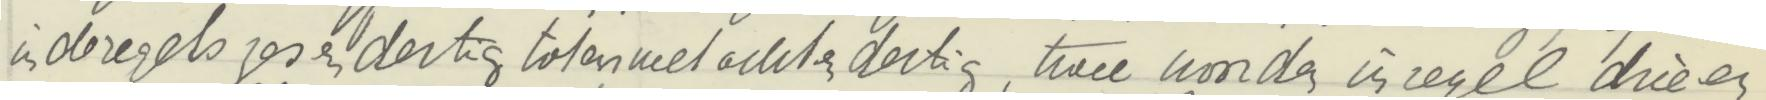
in de regels zes en dertig tot en met acht en dertig, twee woorden in regel drie en
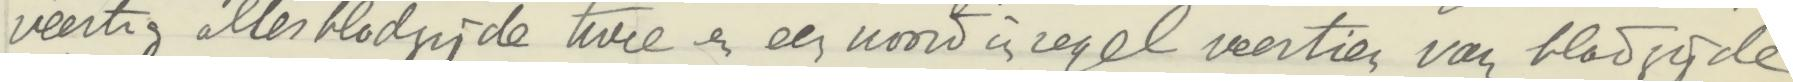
veertig alles bladzijde twee en een woord in regel veertien van bladzijde
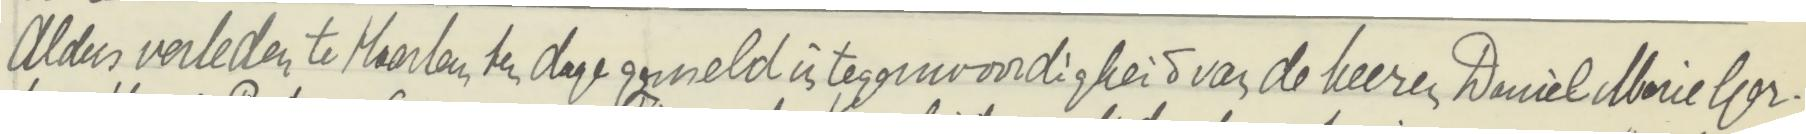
Aldus verleden te Haarlem ten dage gemeld in tegenwoordigheid van de heeren Daniel Marie Ger
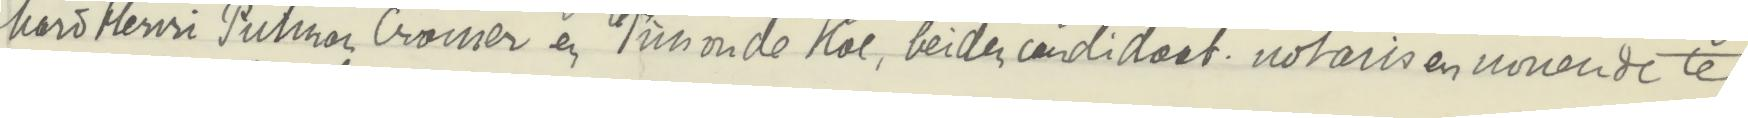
hard Henri Putman Cramer en Timon de Koe, beiden candidaat - notaris en wonende te
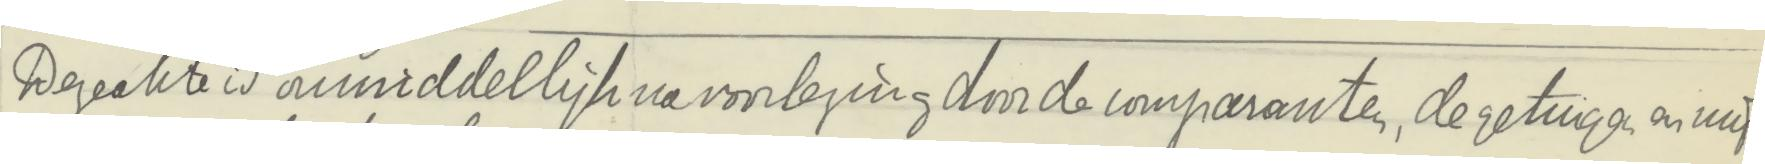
Deze akte is onmiddellijk na voorlezing door de comparanten, de getuijgen en mij
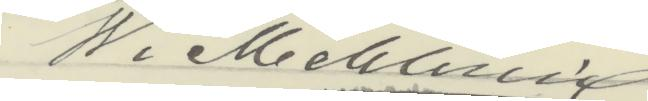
W, Mekking
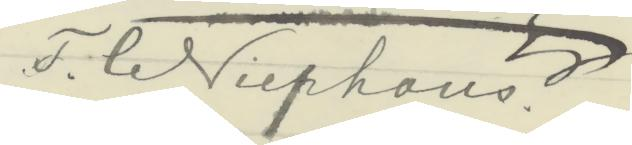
T. C. Niephaus.
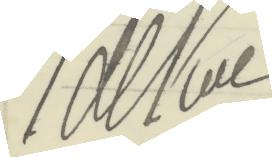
TdeKoe
